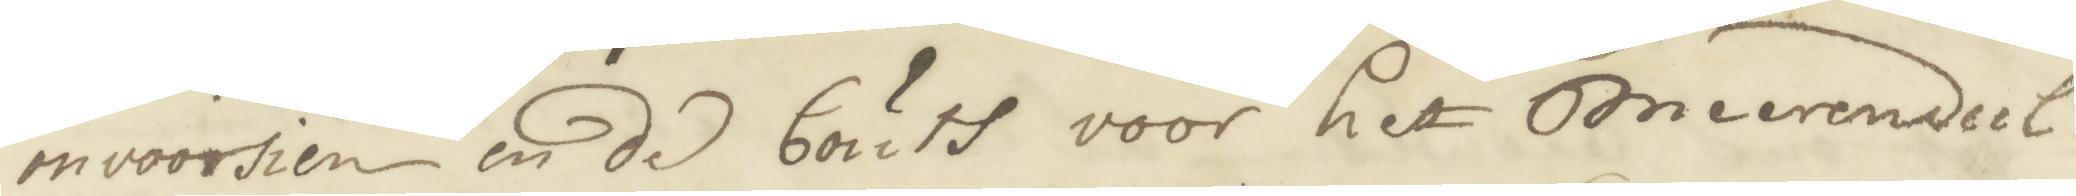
onvoorsien en de bouts voor het meerendeel
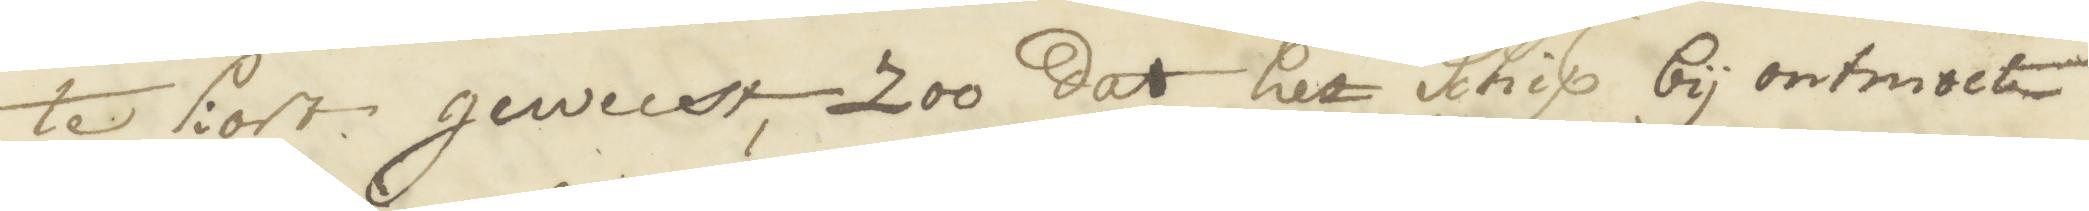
te kort geweest, zoo dat het schip bij ontmoete
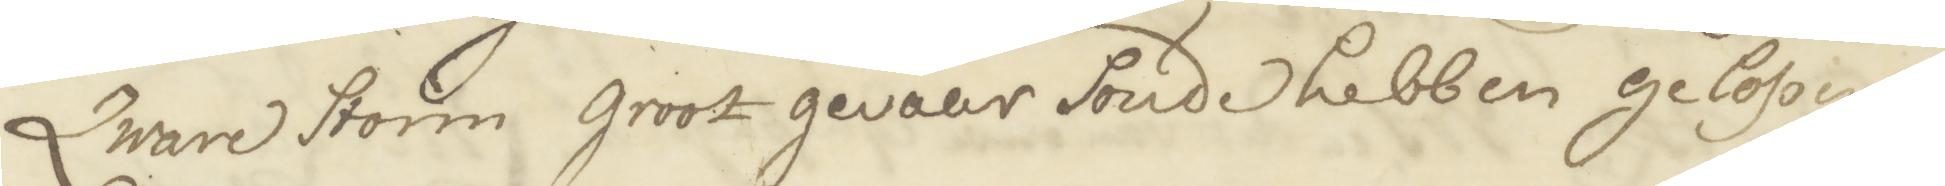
Zware storm groot gevaar soude hebben gelopen;
